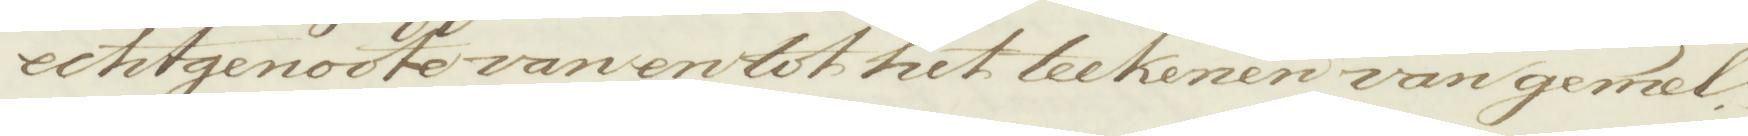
echtgenoote van en tot het teekenen van gemel,
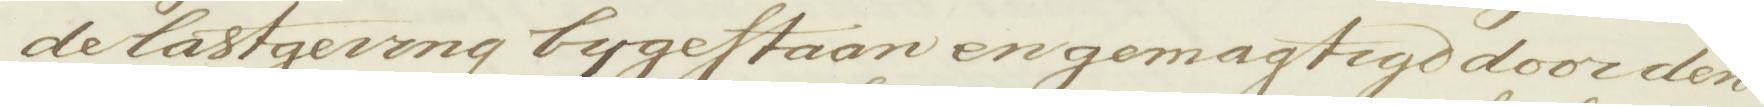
de lastgeving bygestaan en gemagtigd door den
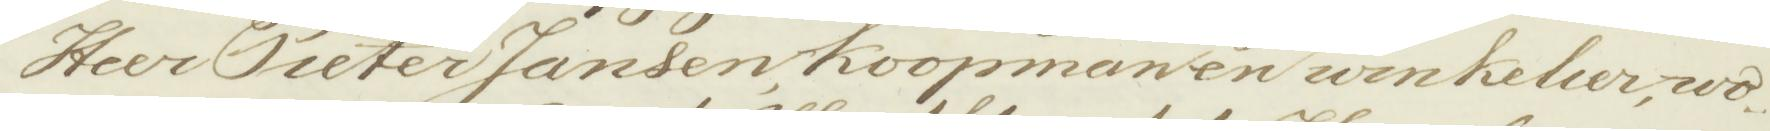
Heer Pieter Jansen koopman en winkelier, wo,
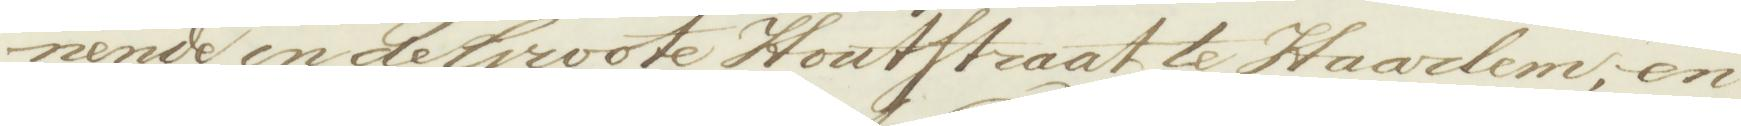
nende in de Groote Houtstraat te Haarlem, en
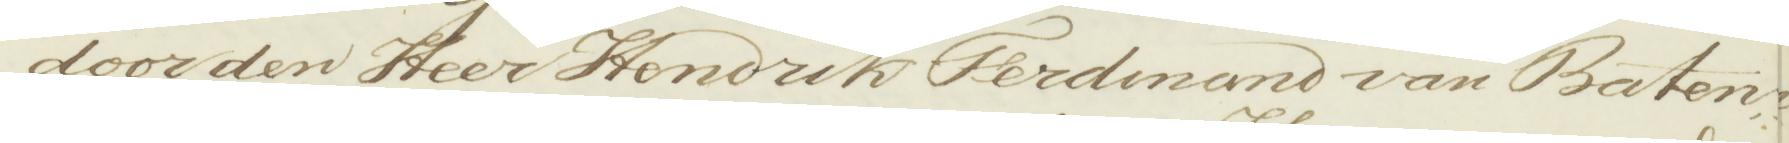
door den Heer Hendrik Ferdinand van Baten,
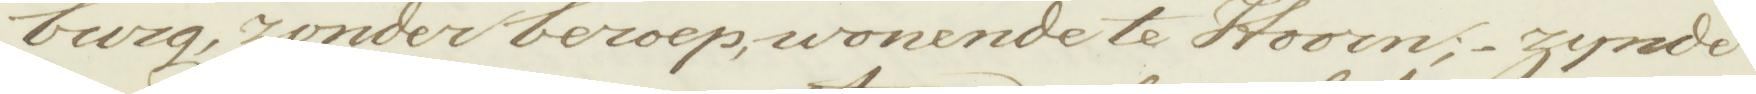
burg, zonder beroep, wonende te Hoorn; - zynde
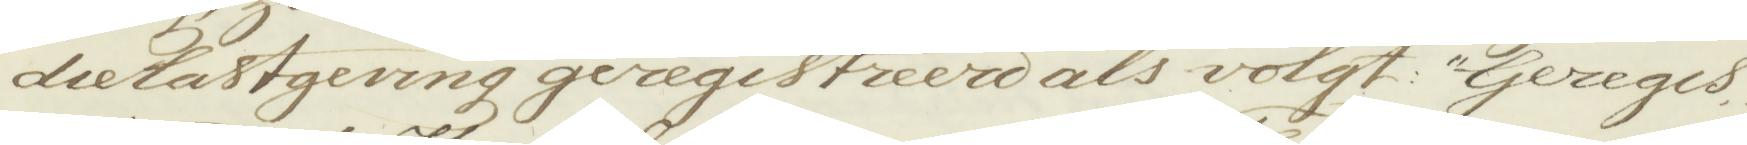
die lastgeving geregistreerd als volgt: "Geregis,
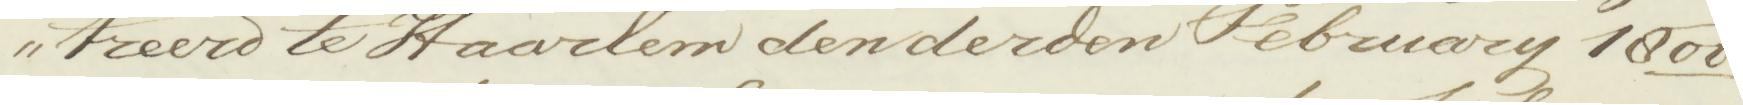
„treerd te Haarlem den derden February 1800
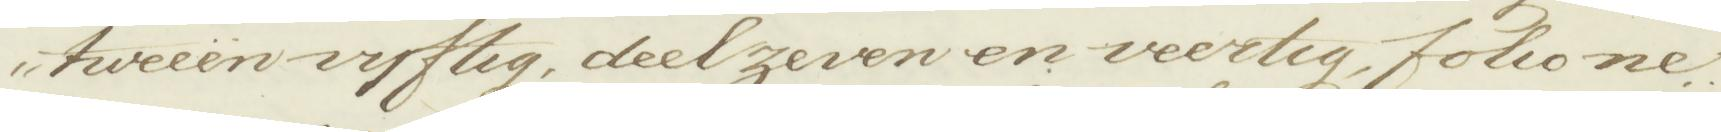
„ tweeën vyftig, deel zeven en veertig, folio ne„
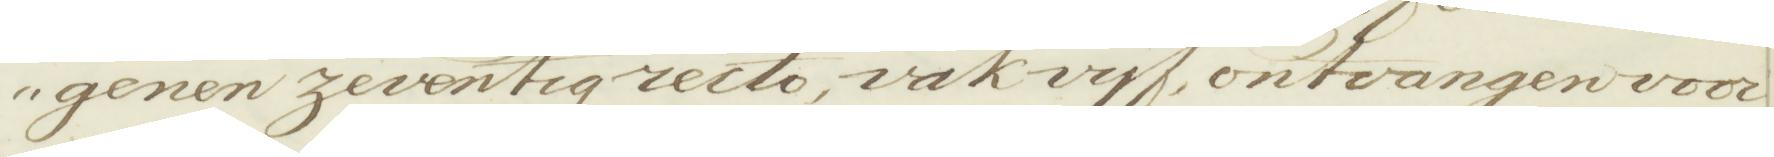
„genen zeventig recto, vak vyf, ontvangen voor
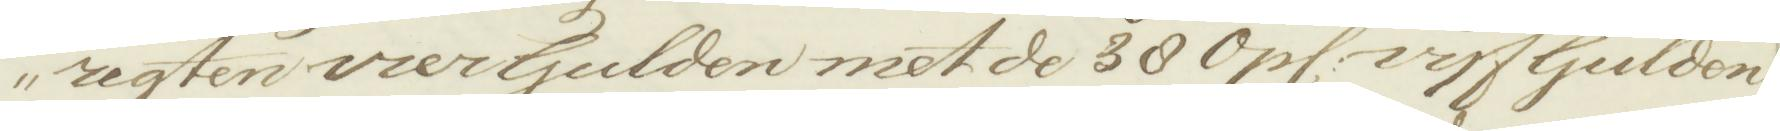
„ regten vier Gulden met de 38 OpC: vyf Gulden
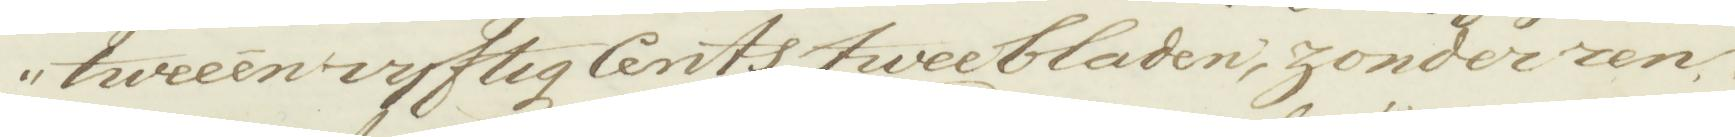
„ tweeën vyftig Cents, twee bladen, zonder ren,
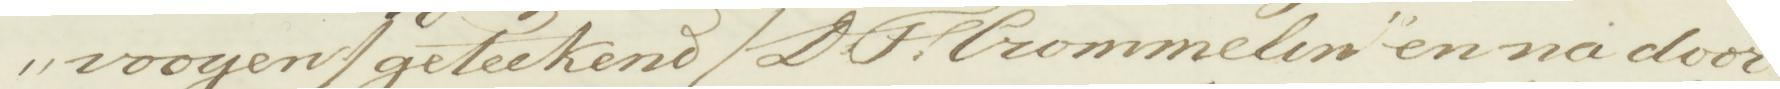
„vooyen / geteekend / D:F: Crommelin" en na door
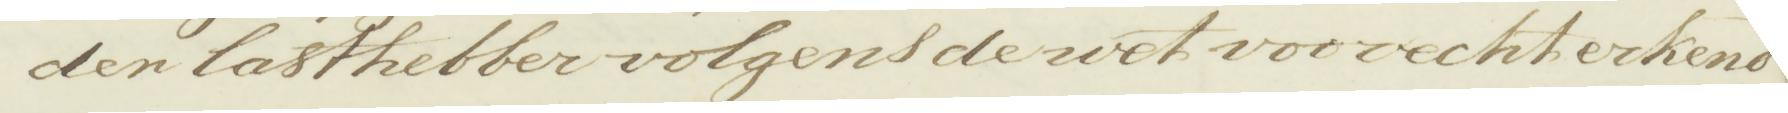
den lasthebber volgens de wet voor echt erkend
